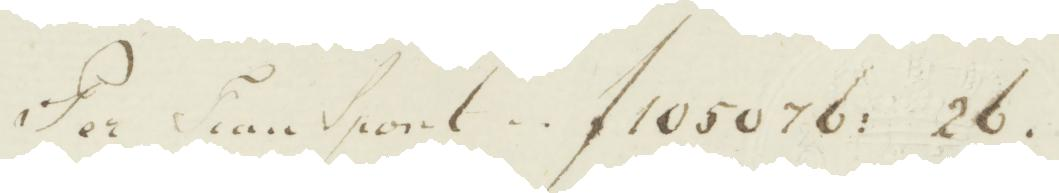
Per Transport .. ƒ105076: 26.
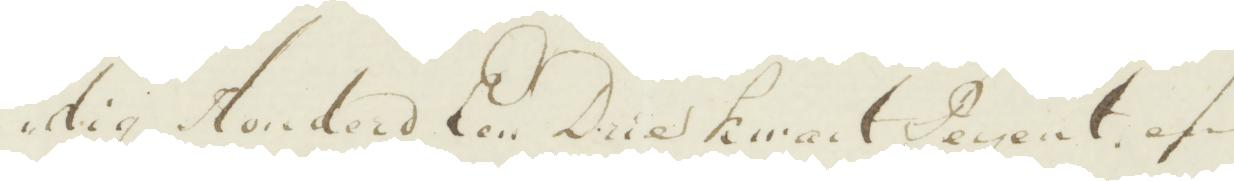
dig Honderd Een Drie kwart Percent en
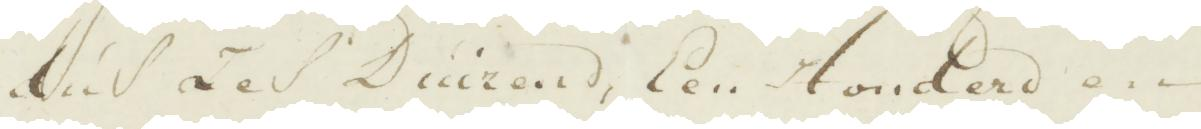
dus Zes Duizend, Een Honderd en
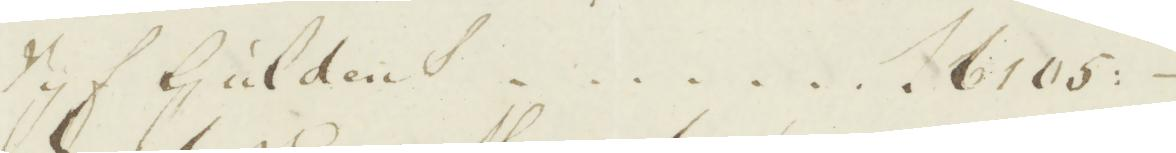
Vijf Guldens . . . . . . .ƒ6105: —
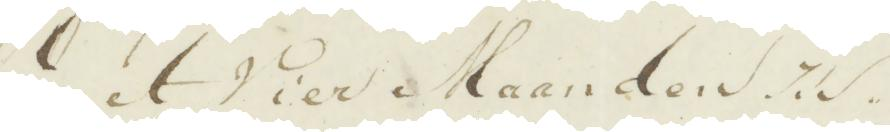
met Vier Maanden In „
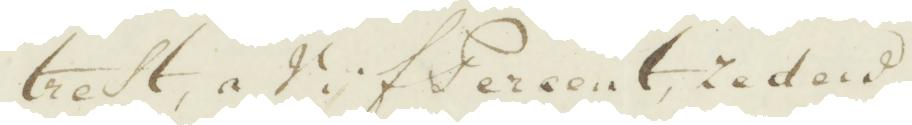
trest, a Vijf Percent, zederd
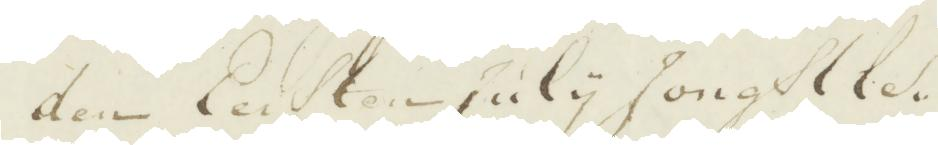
den Eersten Julij Jongstle„
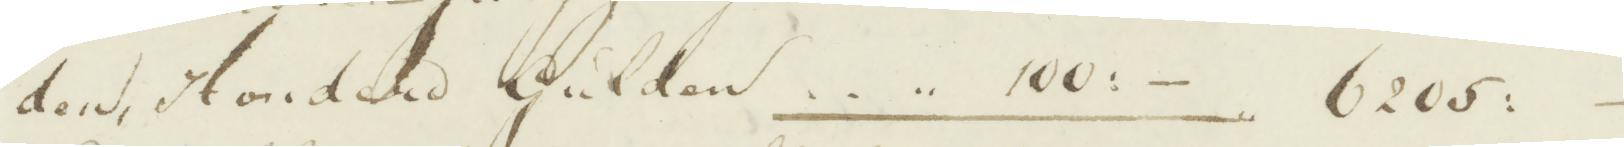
den, Honderd Gulden . . . 100: — 6205: —
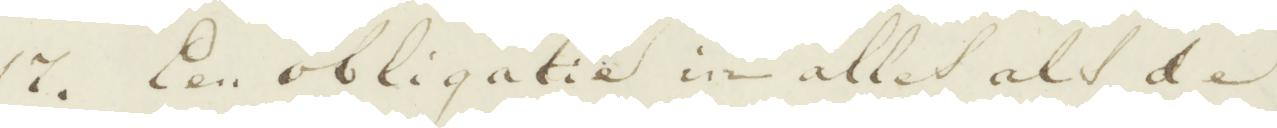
17. Een obligatie in alles als de
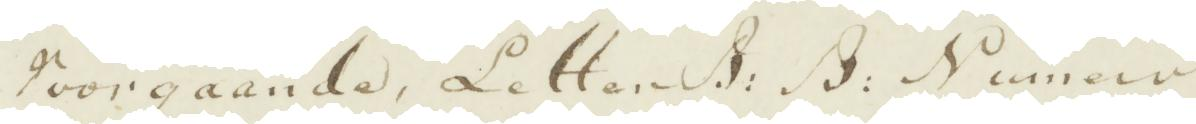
Voorgaande, Letter B: B: Numero
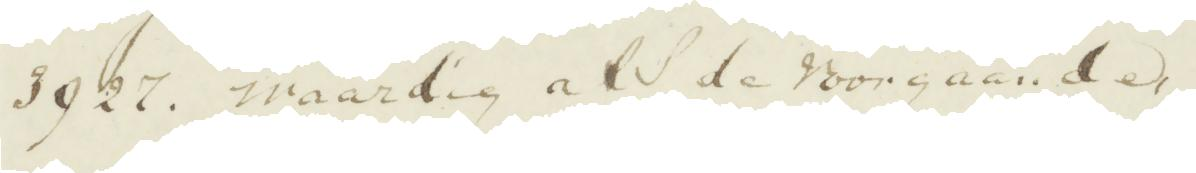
3927. waardig als de voorgaande,
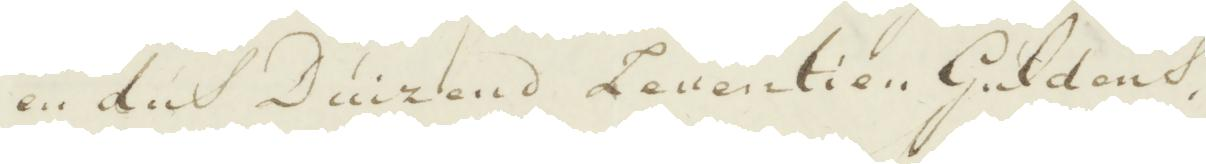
en dus Duizend Zeventien Guldens
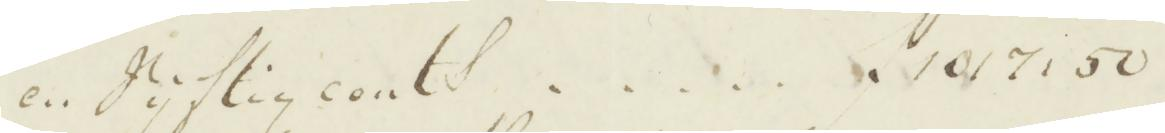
en Vijftig cents . . . . . ƒ 1017:50
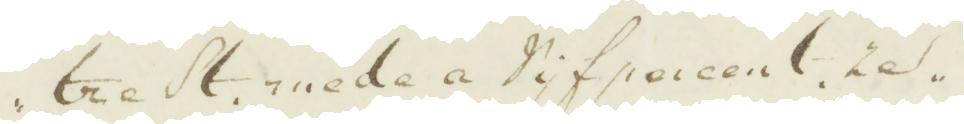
„trest, mede a Vijf percent, ze„
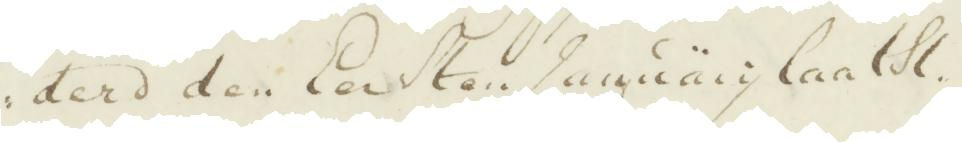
„derd den Eersten Januarij laatst.
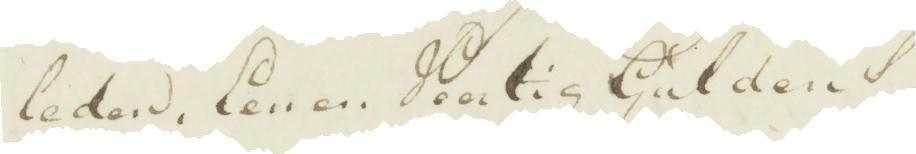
leden, Een en Veertig Guldens
